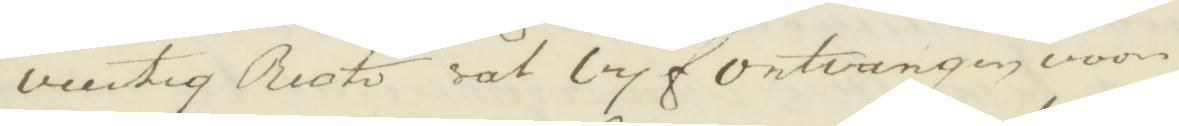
veertig Recto vak vyf ontvangen voor
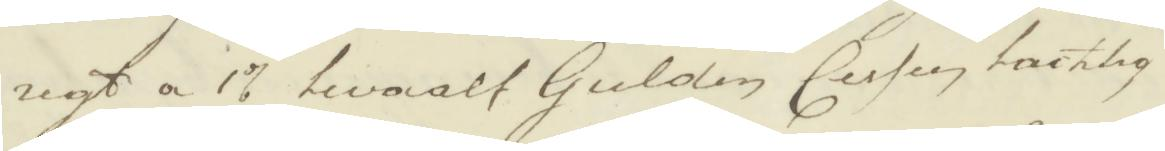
regt a 1% twaalf Gulden Cessien tachtig
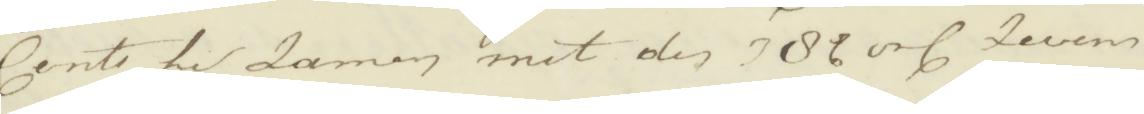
Cents te zamen met den 28% opC Zeven
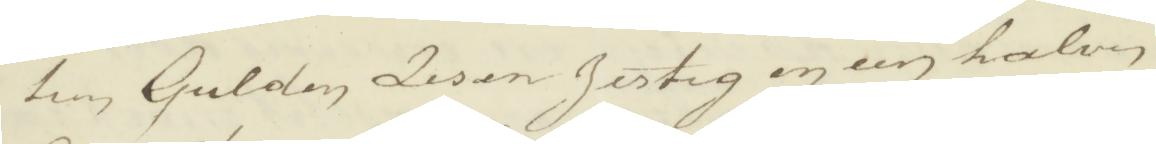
tien Gulden zes en zestig en een halven
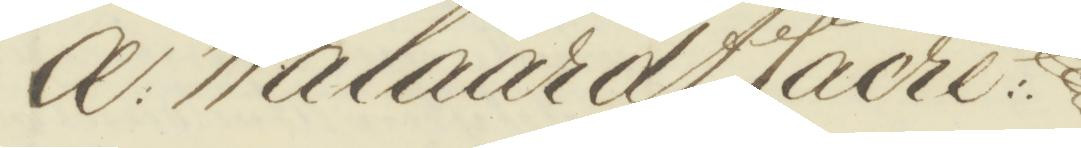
a: Walaardt Sacré..
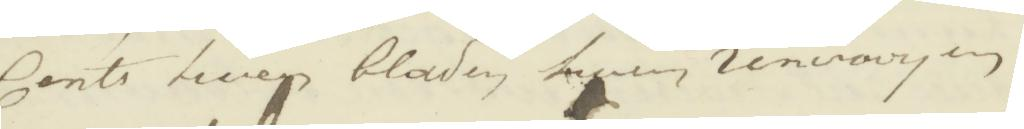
Cents twee bladen tegen renvooyen
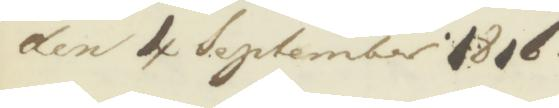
den 4 September 1816.
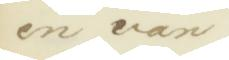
en van
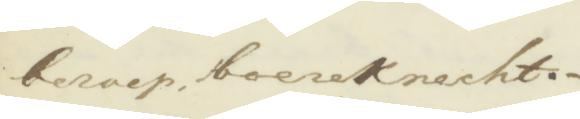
beroep, boereknechte
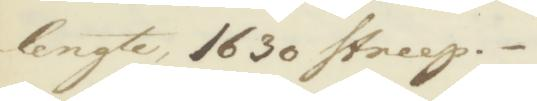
lengte, 1630 streep.-
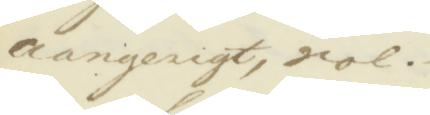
aangezigt, vol.
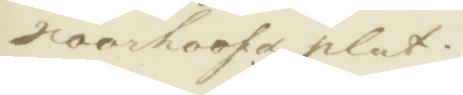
Voorhoofd, plat.
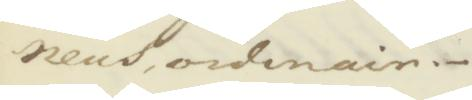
neus, ordinair.-
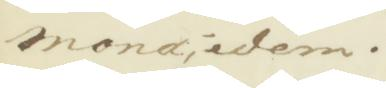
mond, idem.
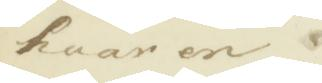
haar en
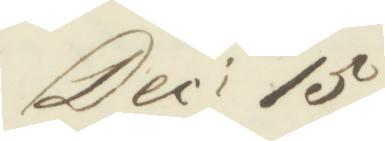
Dec: 15
